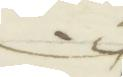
H
